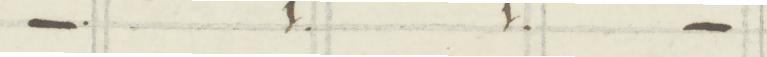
—. 1. 1. —
